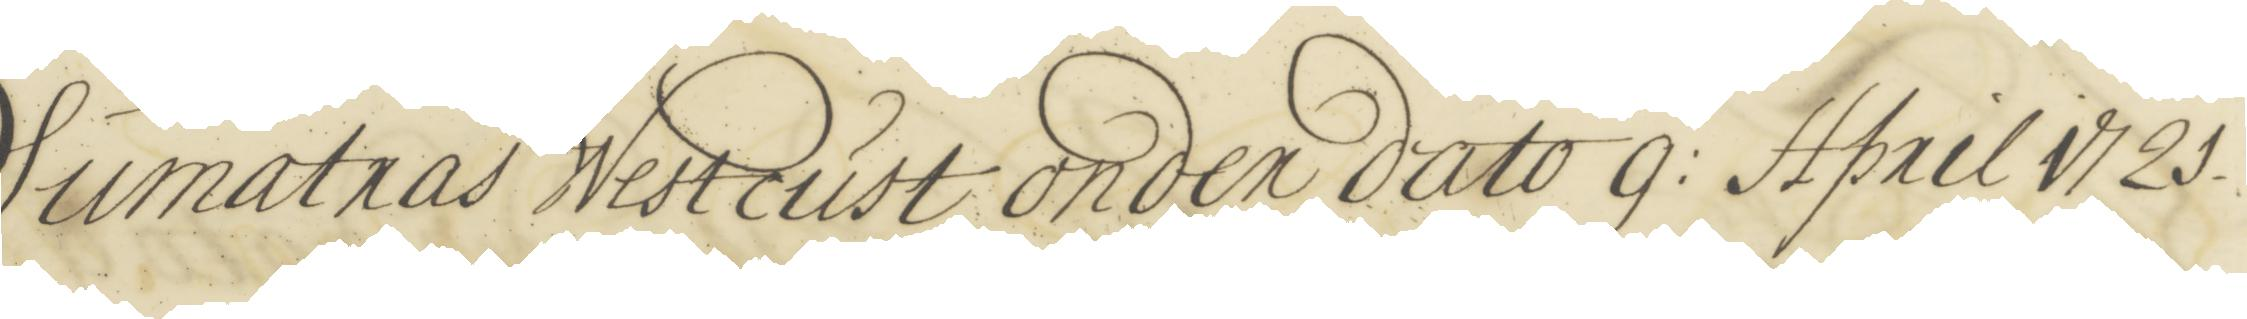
Sumatras Westcust, onder dato 9:' April 1721.
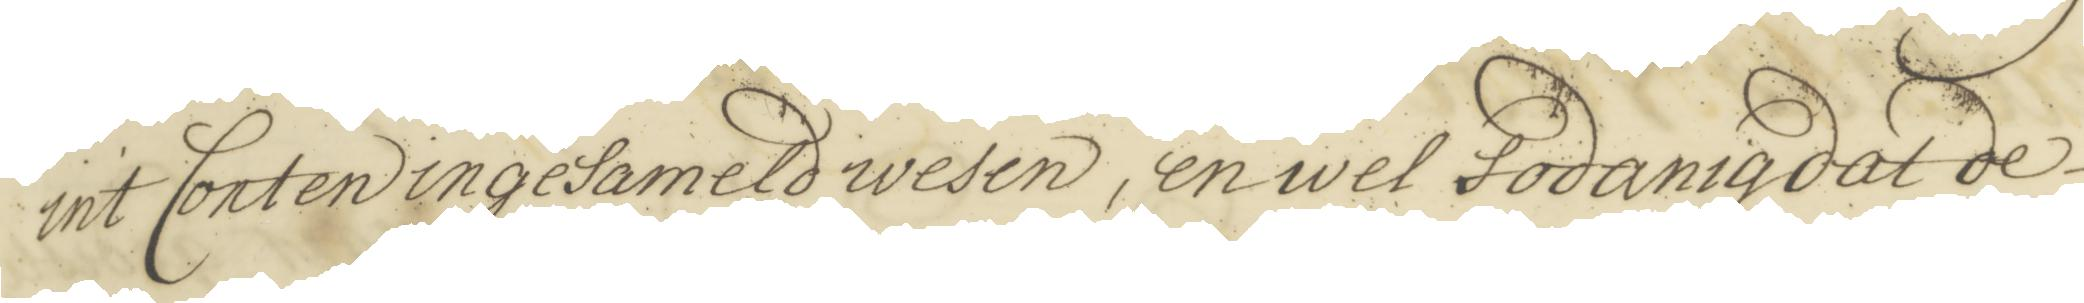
in’t Corten ingesameld wesen, en wel sodanig dat de
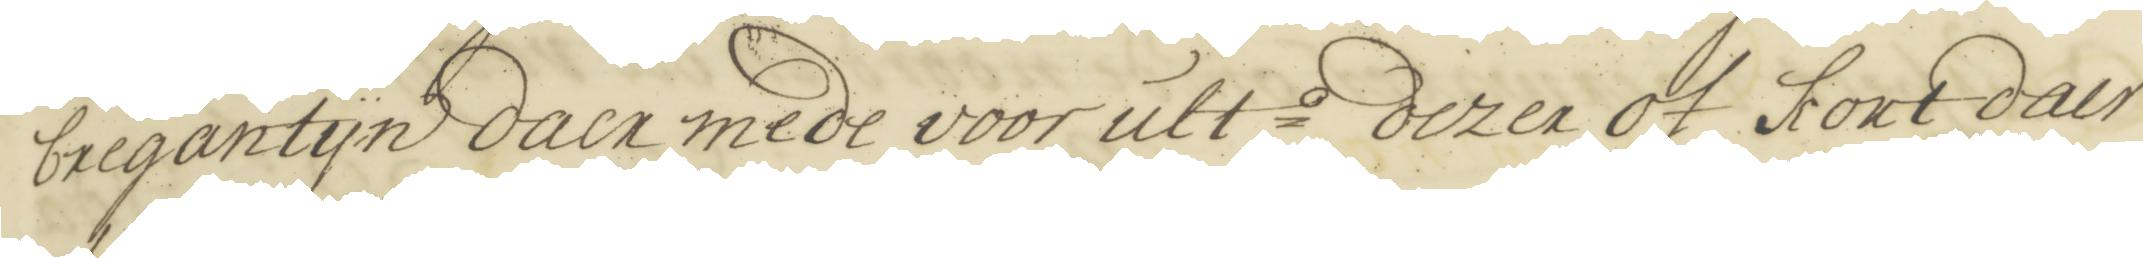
bregantijn daer mede voor ult=o dezer of kort daer
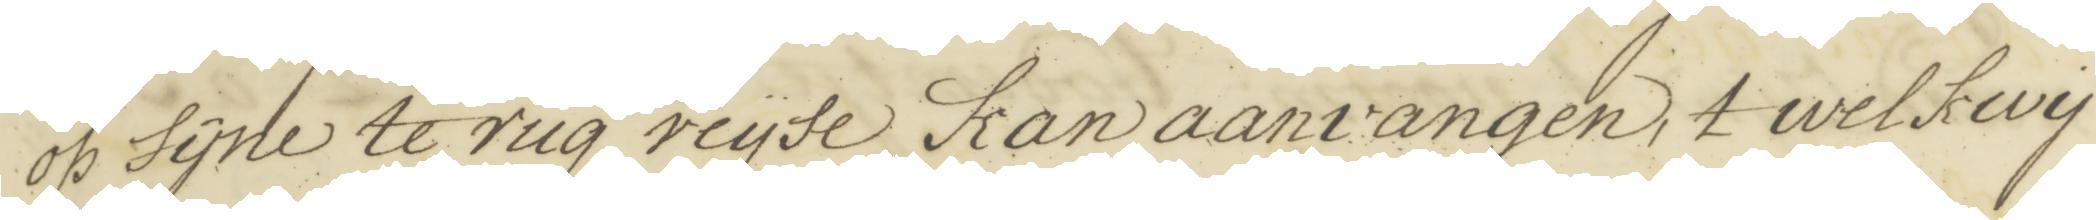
op sijne te rug reijse kan aanvangen, t welk wij
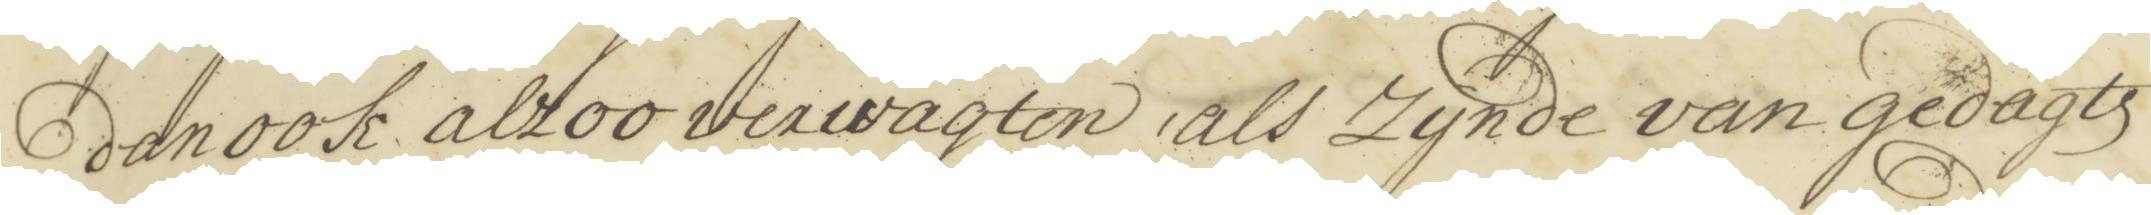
dan ook alzoo verwagten, als zijnde van gedagten
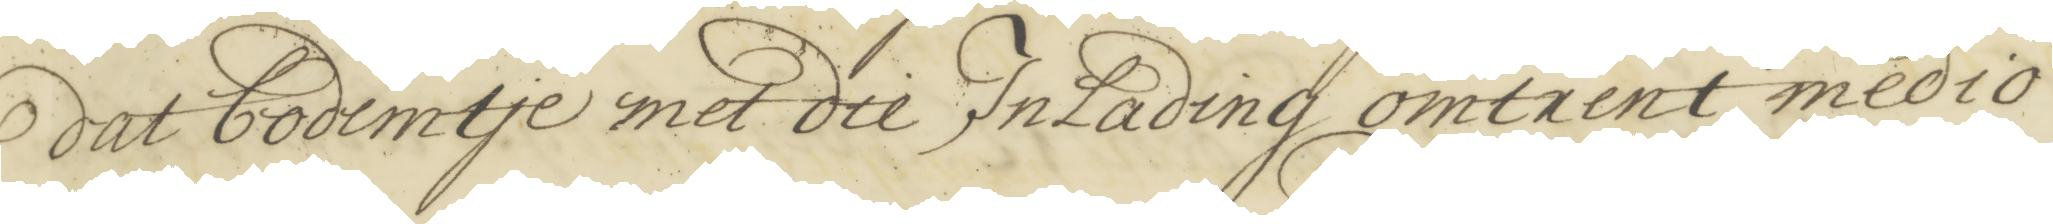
dat bodemtje met die Inlading omtrent medio -
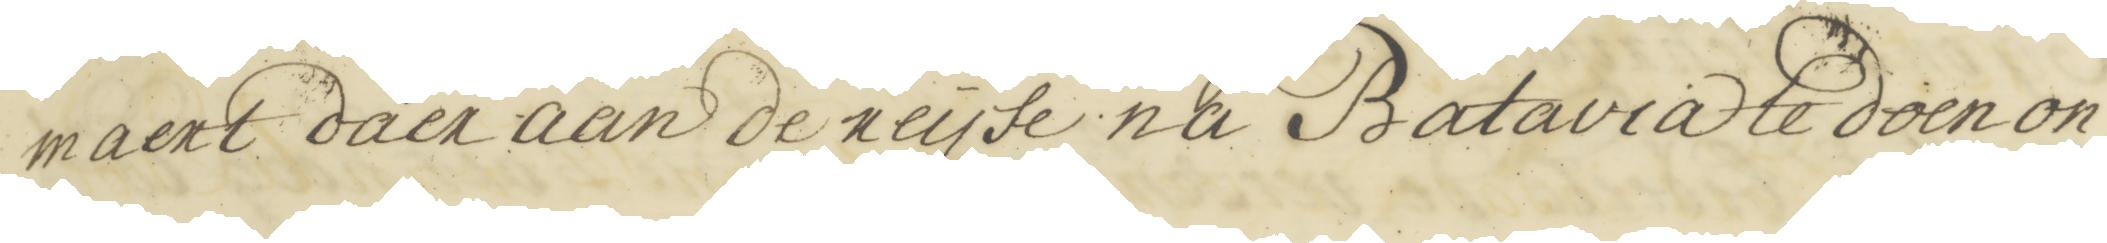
maert daer aan de reijse na Batavia te doen on
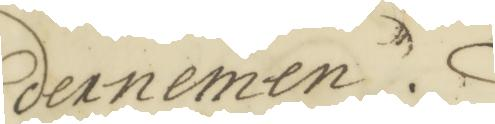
dernemen. _
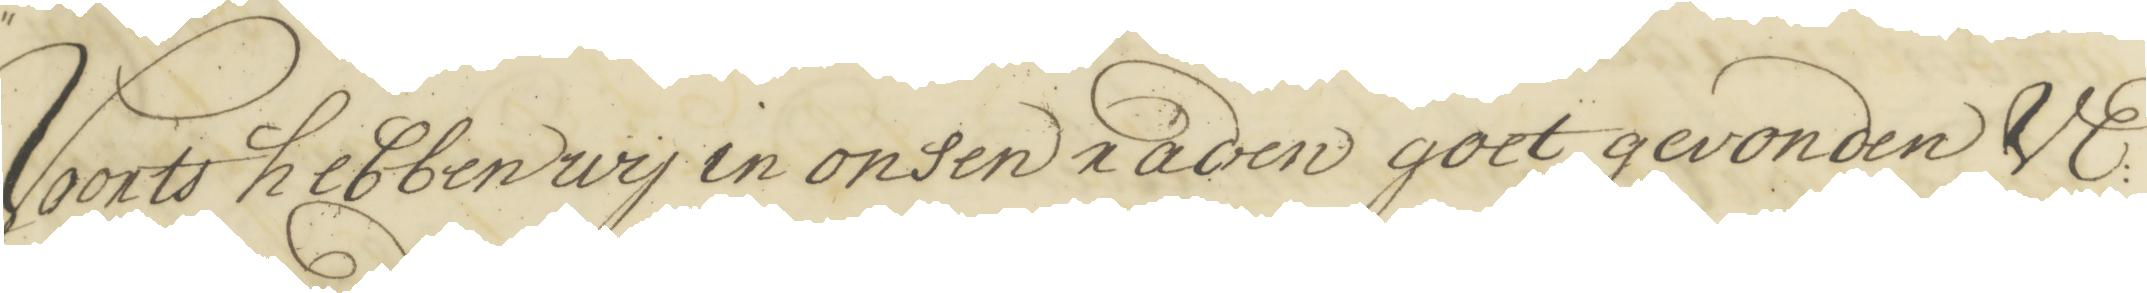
Voorts hebben wij in onsen raden goet gevonden VE:
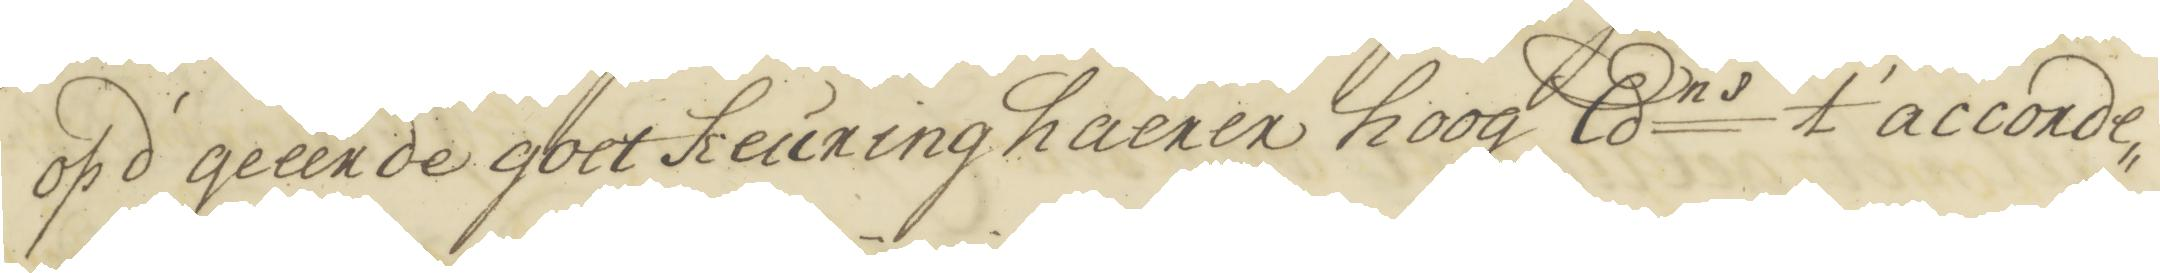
op d’ geeerde goet keuring haerer hoog Ed=ns t’ accorde„
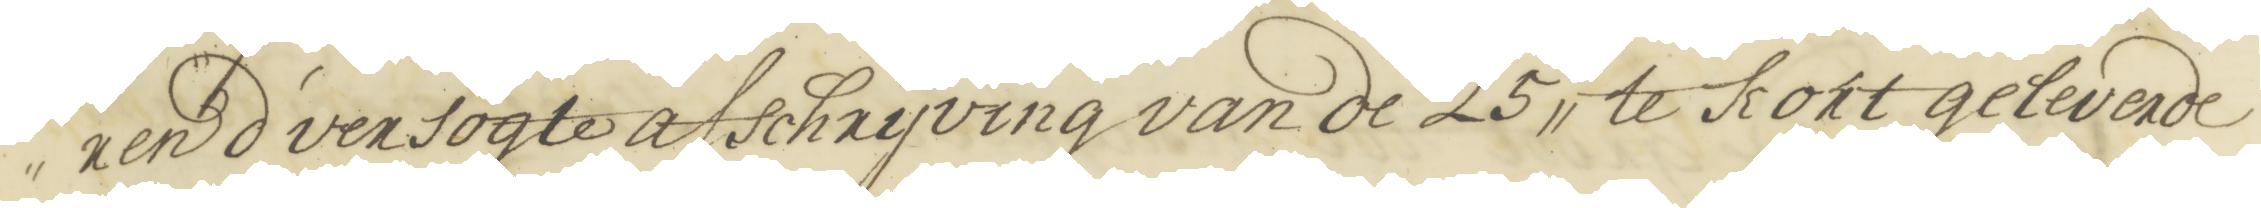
„ ren d’ versogte afschrijving van de 25„' te kort geleverde
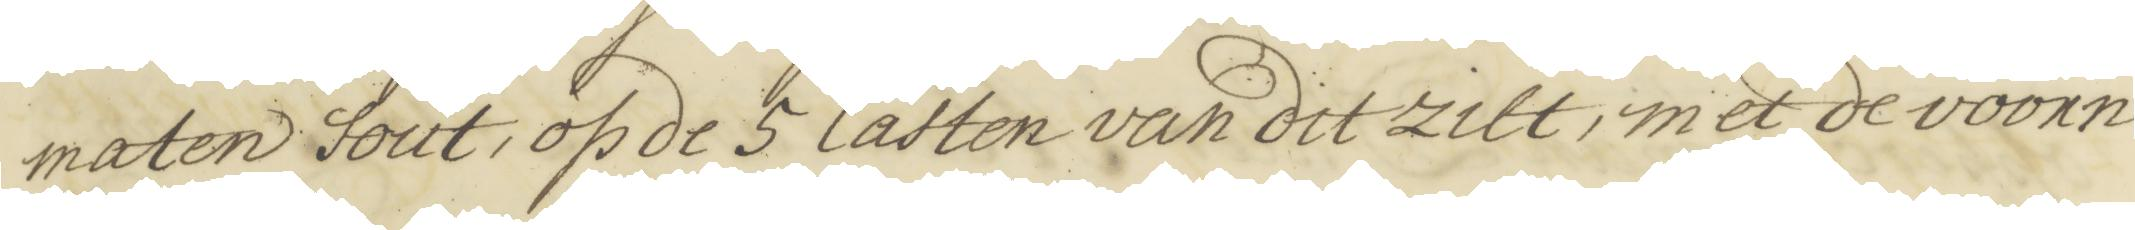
maten sout, op de 5 lasten van dit zilt, met de voorn:e
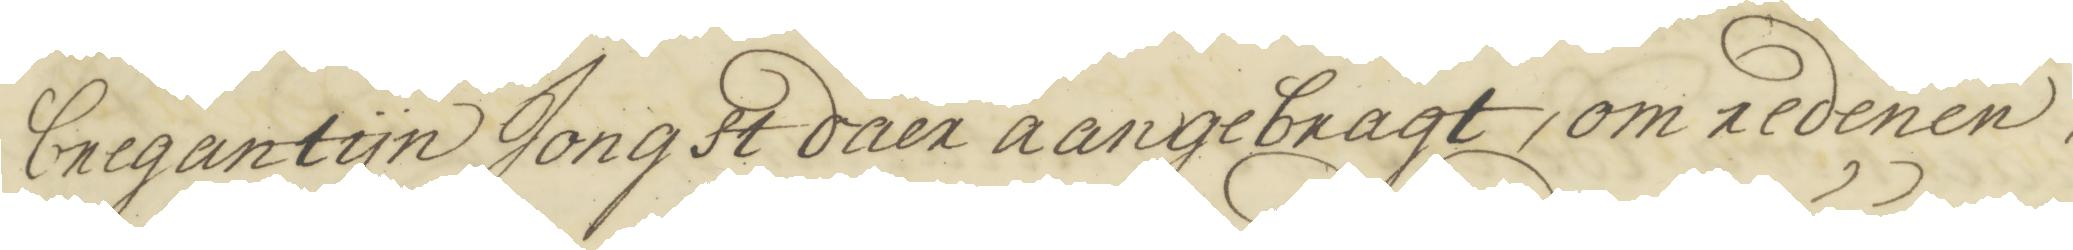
bregantijn Jongst daer aangebragt, om redenen,
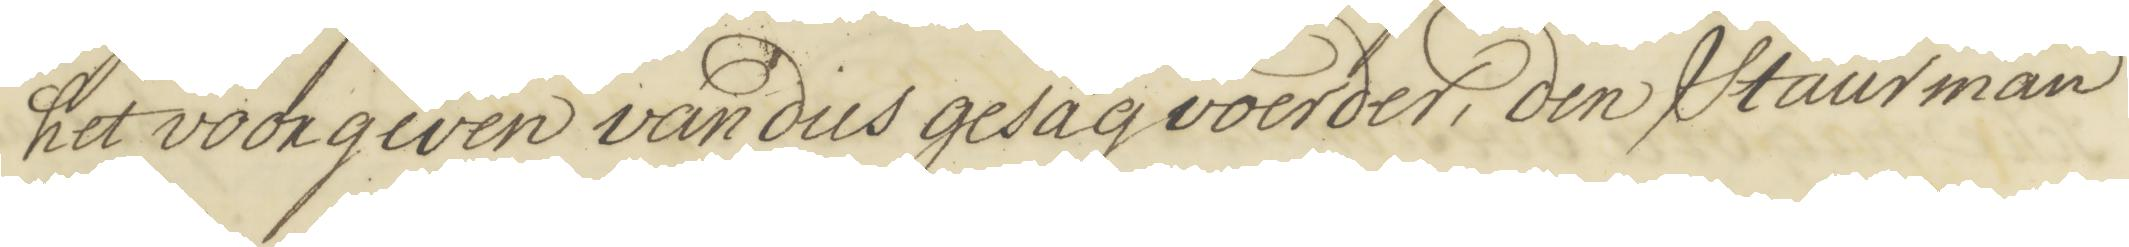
het voorgeven van dus gesagvoerder, den stuurman
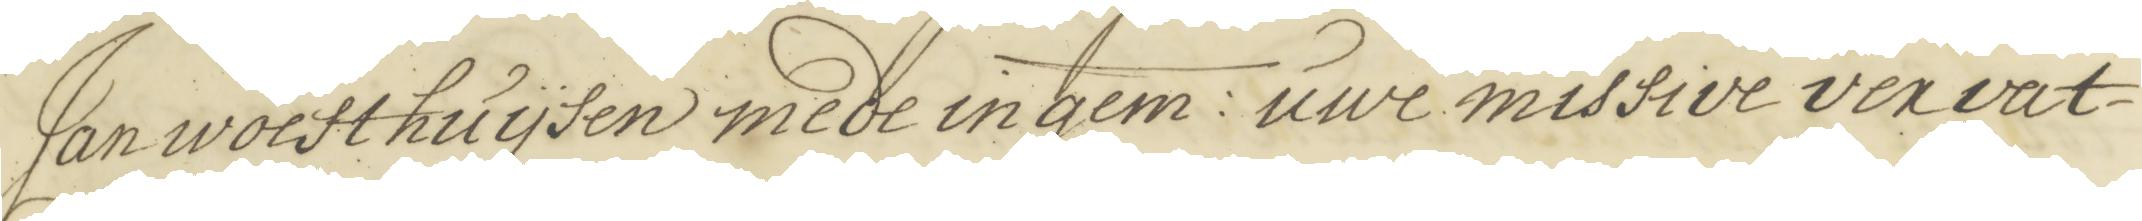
Jan woesthuijsen mede in gem: uwe missive vervat-
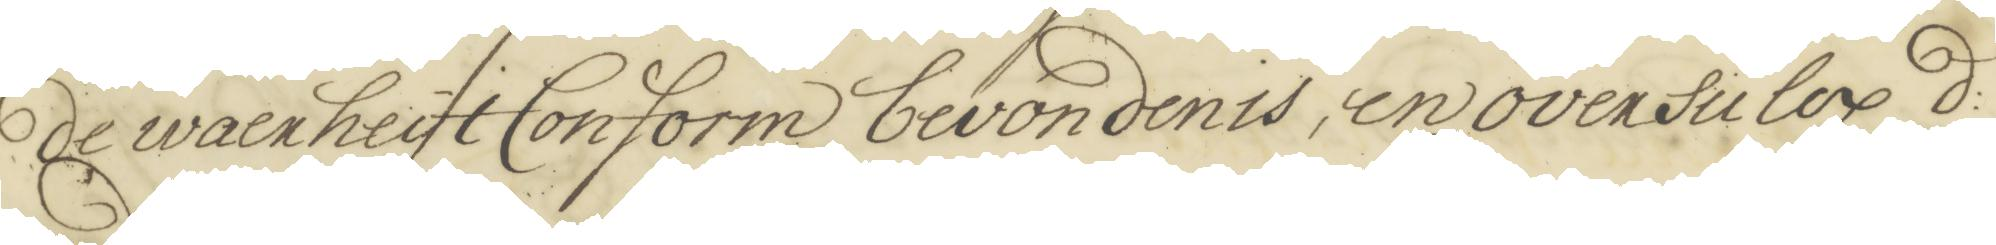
de waerheijt Conform bevondenis, en oversulcx d:e
